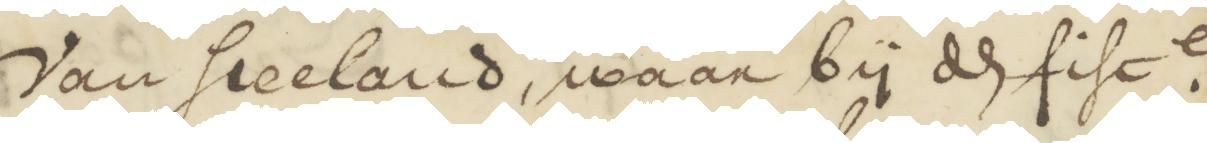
van steeland, waar bij den fisc.l
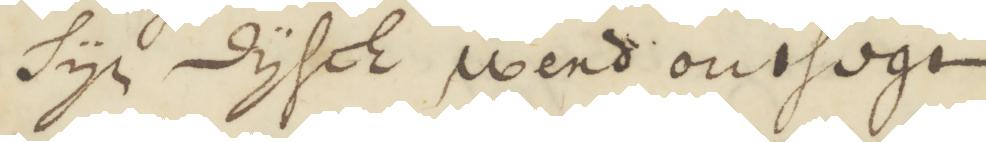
sijn Eijsch werd ontsegt
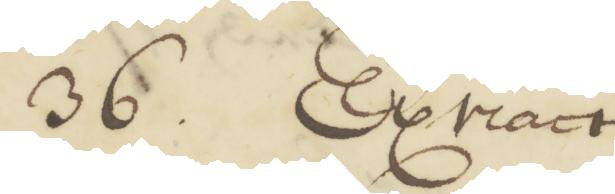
36. Extract
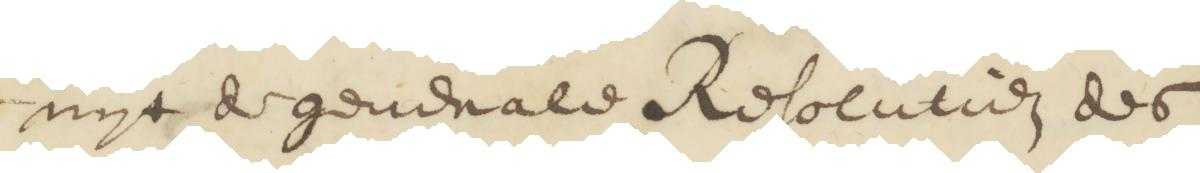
uijt de generale Resolutie des
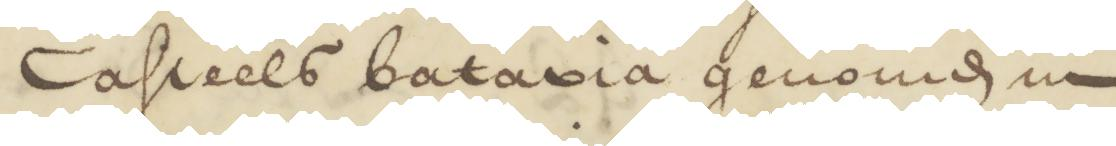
Casteels batavia genomen in
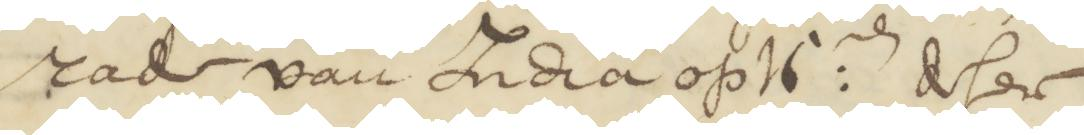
rade van India op 15:en deser
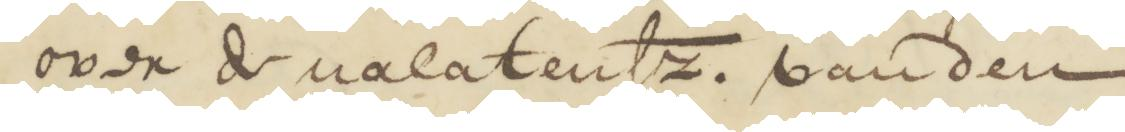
over de nalatensz. van den
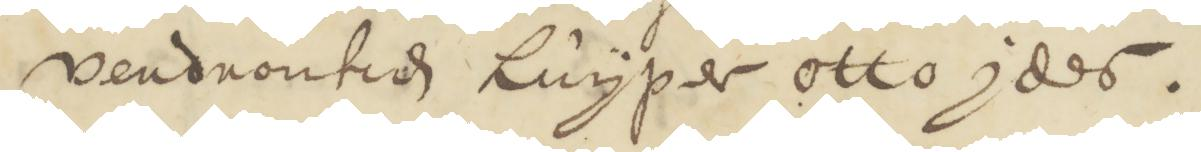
verdronken kuijper otto jdes.
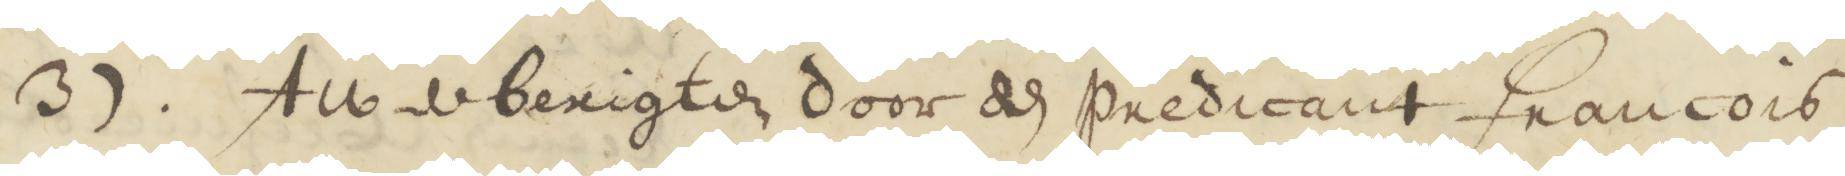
31. twee berigten door den predicant Francois
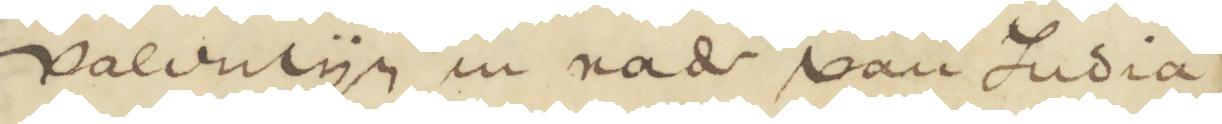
Valentijn in rade van India
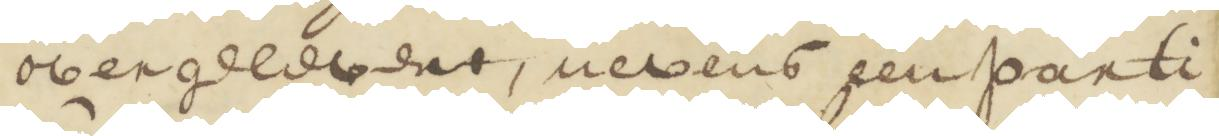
overgelevert, nevens een parti
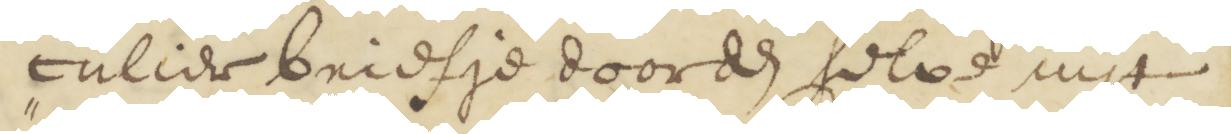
„culier briefje door den selve uijt
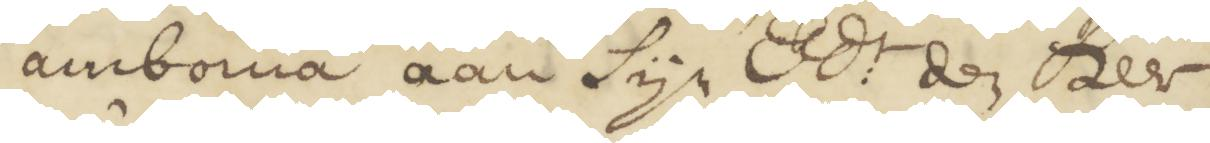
amboina aan sijn Ed:t den Heer
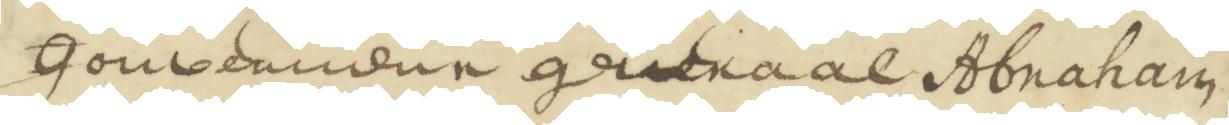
Gouverneur generaal Abraham
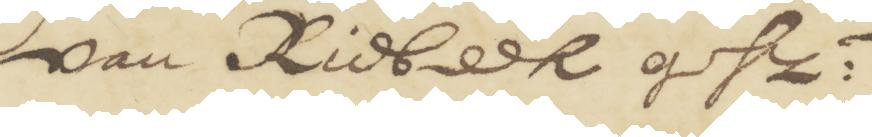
van Riebeek gesz:
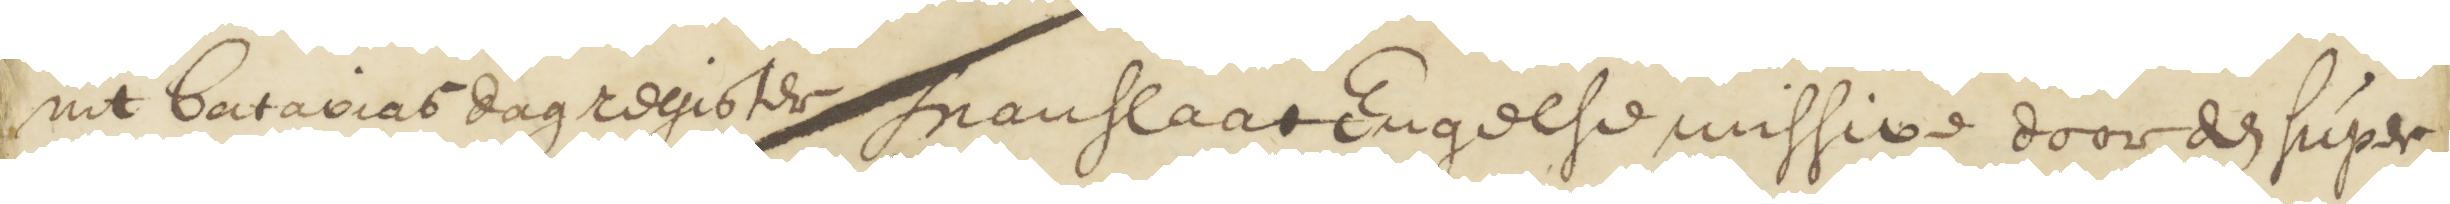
uit batavias dag registe Translaat Engelse missive door den super
